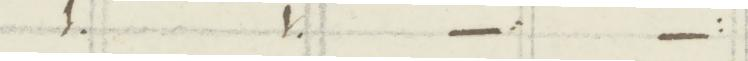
1. 1. —: —:
